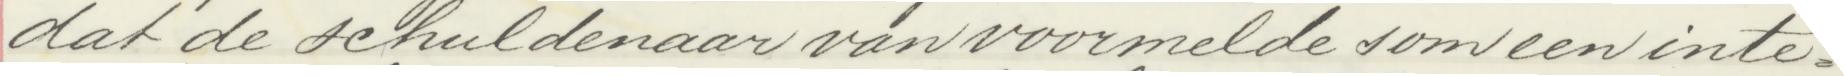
dat de schuldenaar van voormelde som een inte=
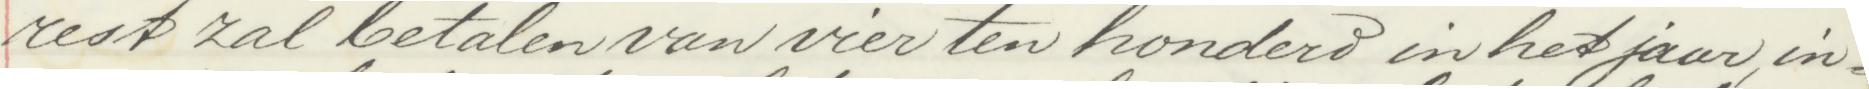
rest zal betalen van vier ten honderd in het jaar in=
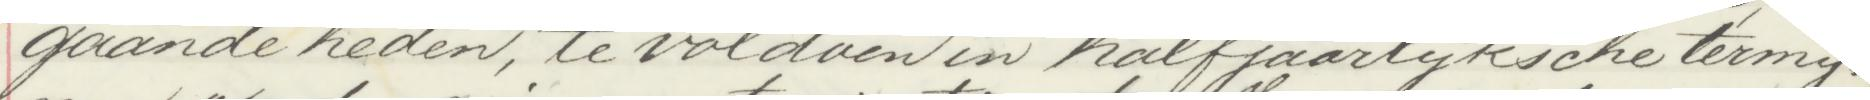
gaande heden, te voldoen in halfjaarlijksche termij=
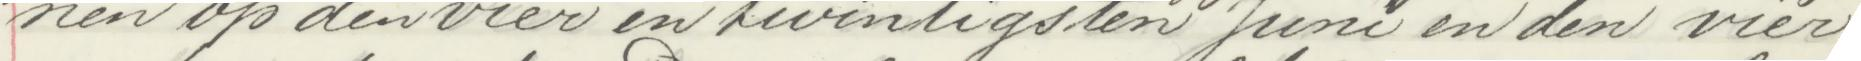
nen op den vier en twintigsten Juni en den vier
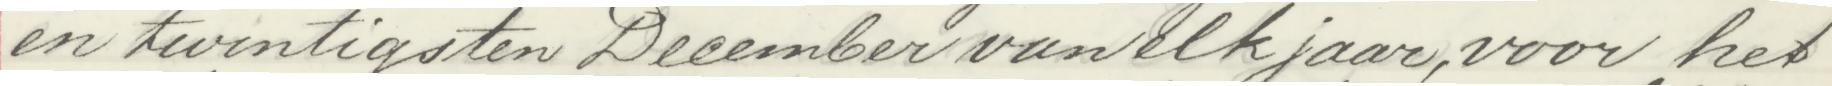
en twintigsten December van elk jaar, voor het
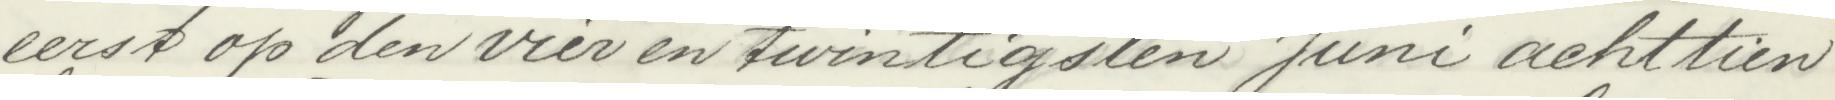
eerst op den vier en twintigsten Juni achttien
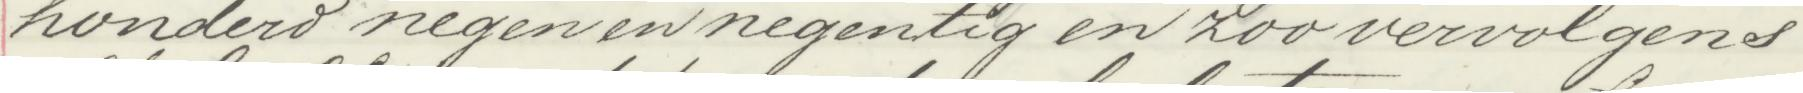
honderd negen en negentig en zoo vervolgens
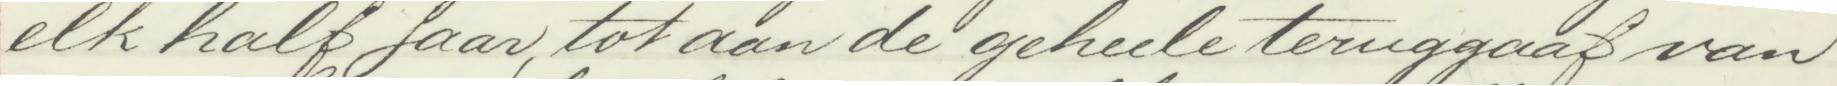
elk half jaar, tot aan de geheele teruggaaf van
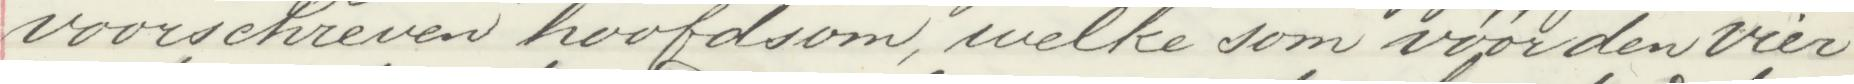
voorschreven hoofdsom, welke som vóór den vier
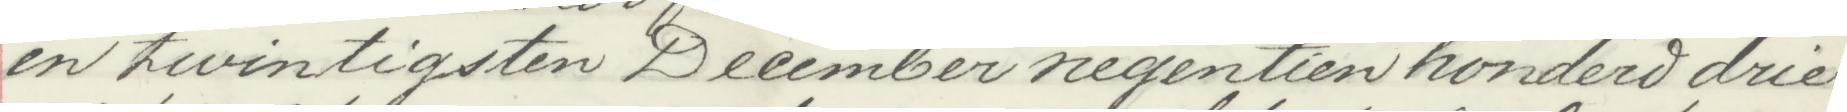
en twintigsten December negentien honderd drie
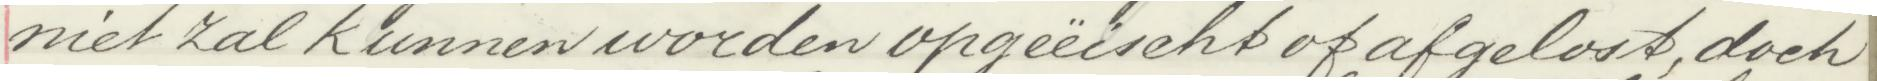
niet zal kunnen worden opgeëischt of afgelost, doch
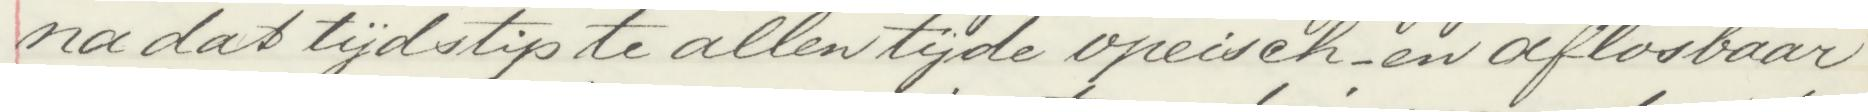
na dat tijdstip te allen tijde opeisch- en aflosbaar
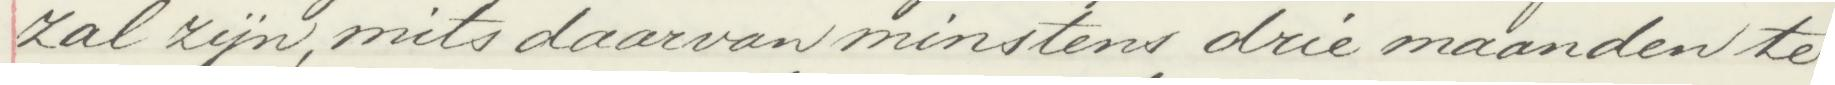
zal zijn, mits daarvan minstens drie maanden te
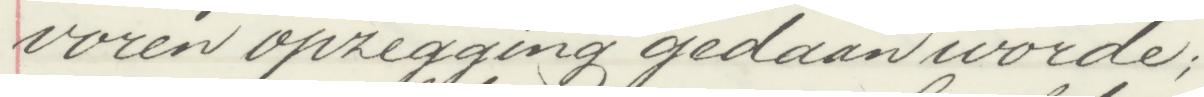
voren opzegging gedaan worde;
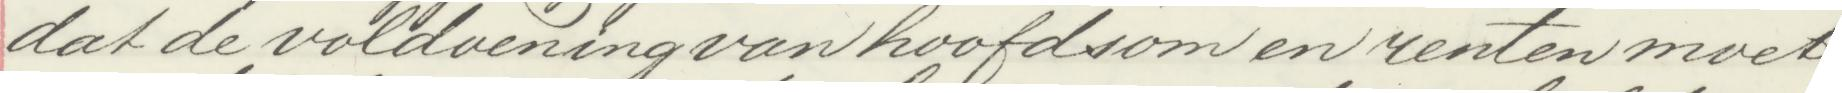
dat de voldoening van hoofdsom en renten moet
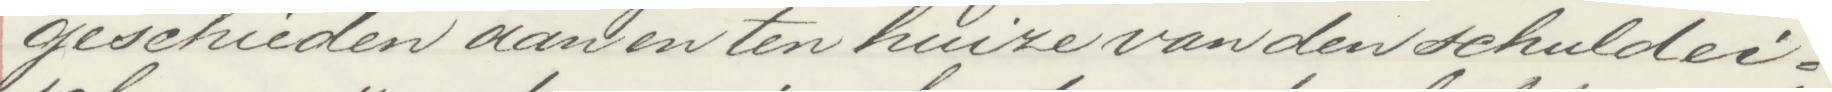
geschieden aan en ten huize van den schuldei=
